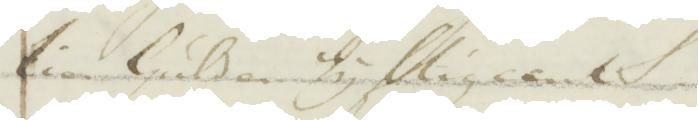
tien Gulden vijftig cents
